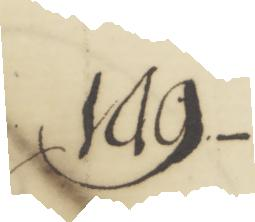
149._
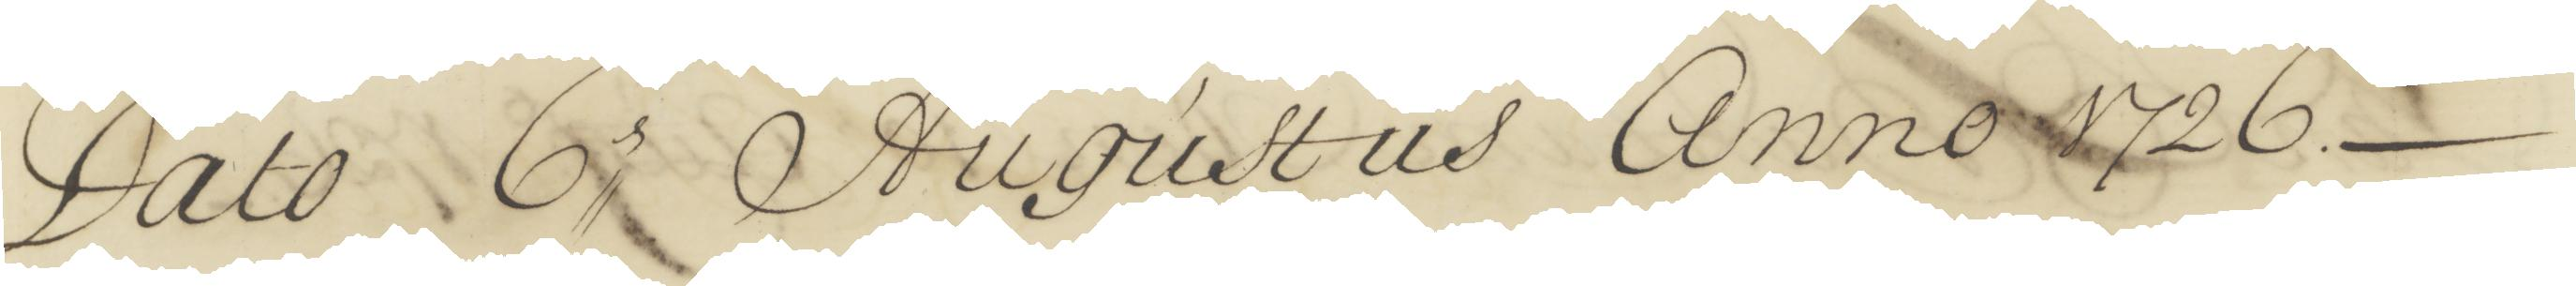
Dato 6„en Augustus Anno 1726. _
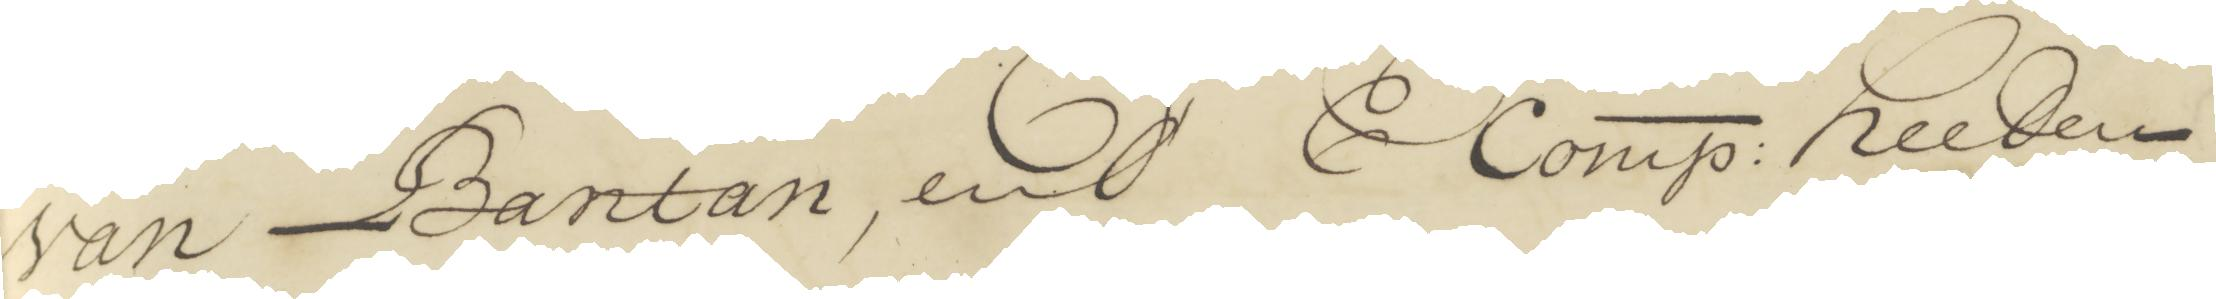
van Bantan, en d’ E Comp: heeden
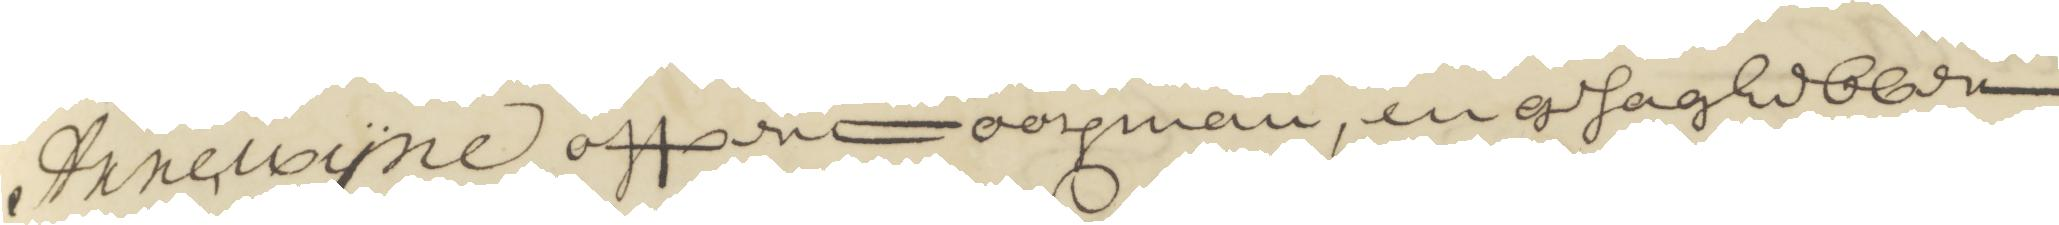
Arrewijne oppercoopman, en gesaghebber
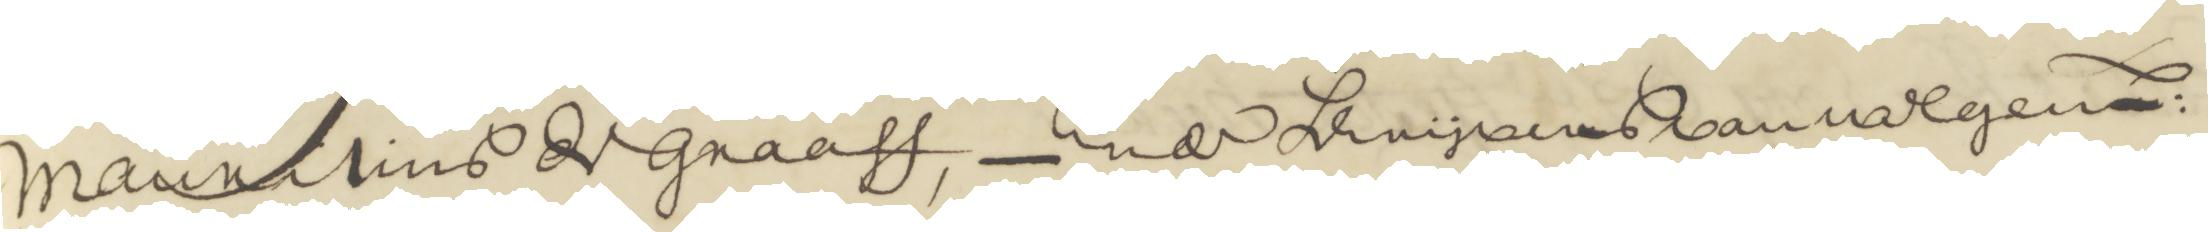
Mauritius de graaff, _ ende schrijvens van wegen:
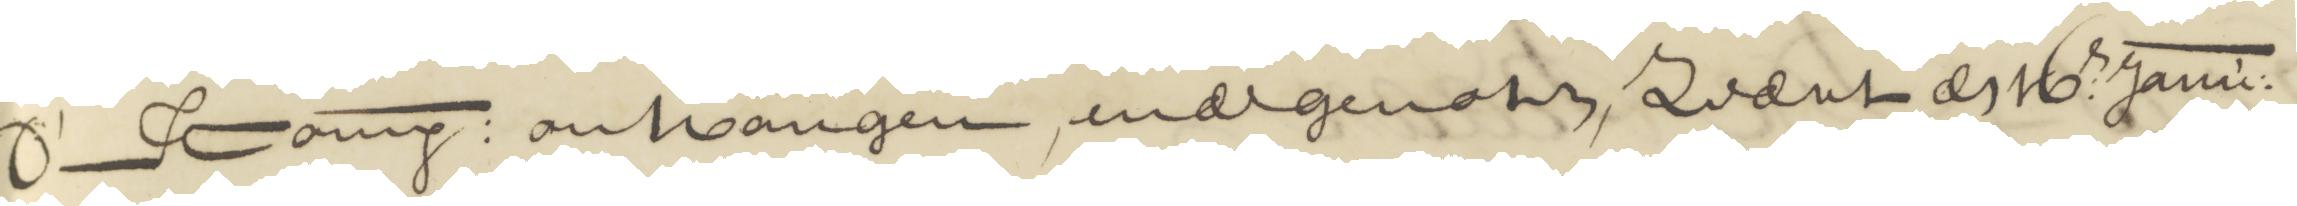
d’ Ecomp: ontvangen, ende genoten, zedert den 16:en Janu:
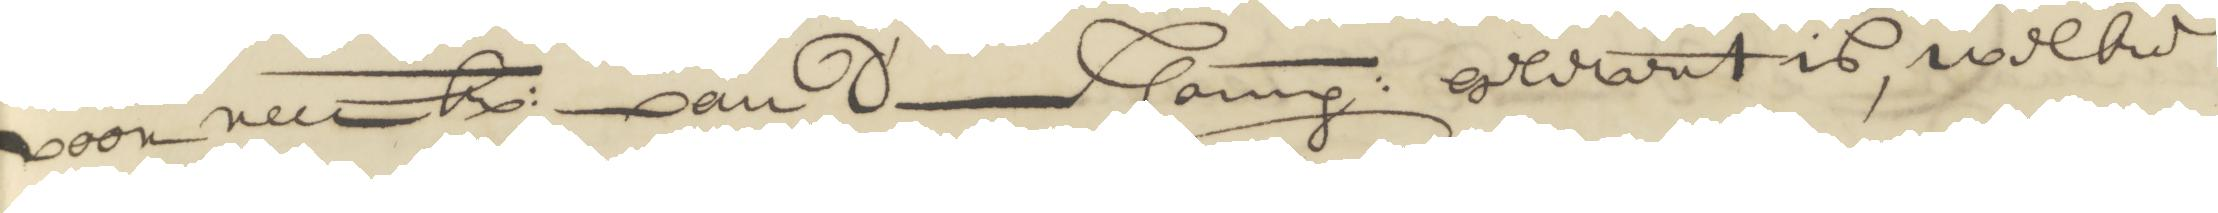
voor reeck: van d’ EComp: gelevert is, welke
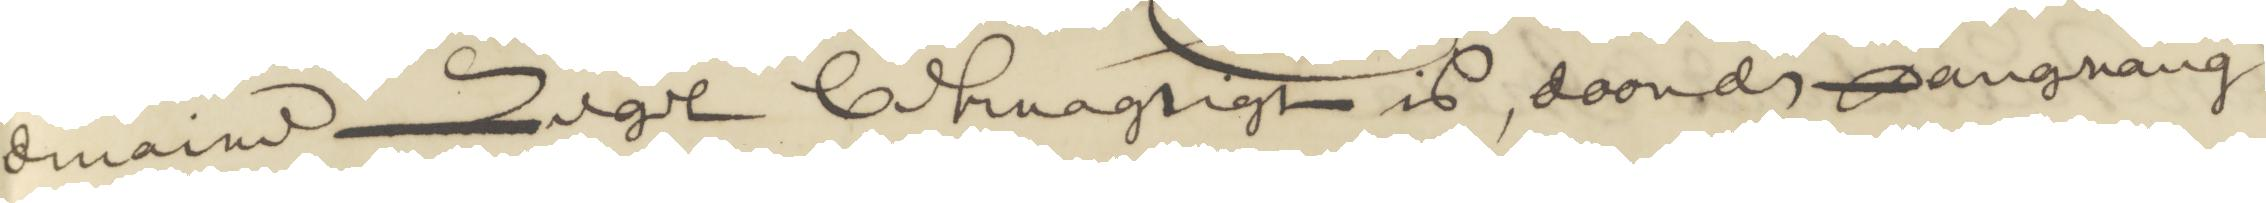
dinaire zegel bekragtigt is, door den pangrang
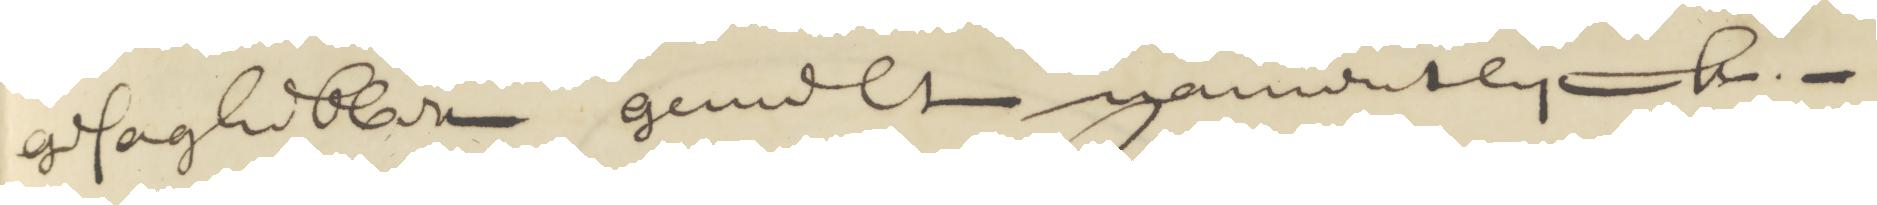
gesaghebber gemelt namentlyck. -
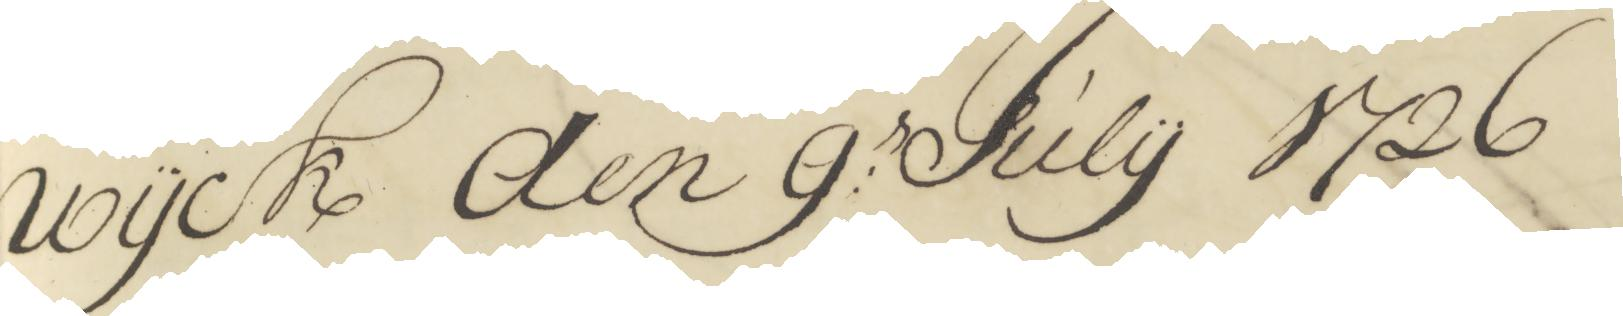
wijck den 9:en Julij 1726
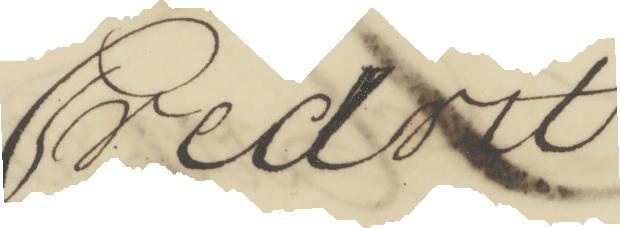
Credrit
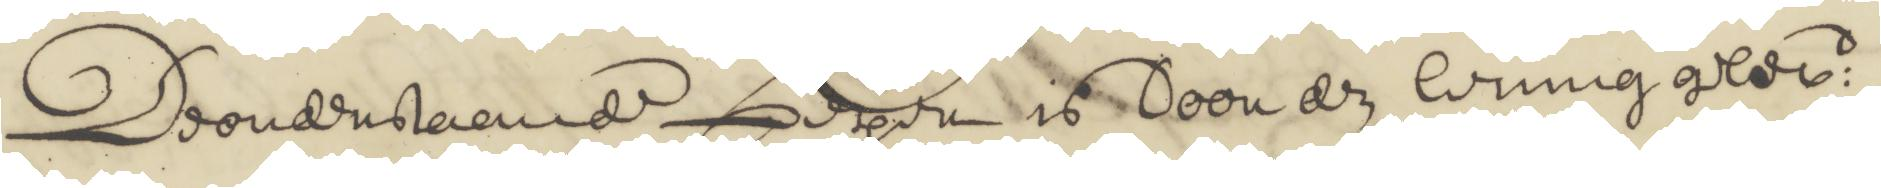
De onderstaande peper is door den lening gelev:d
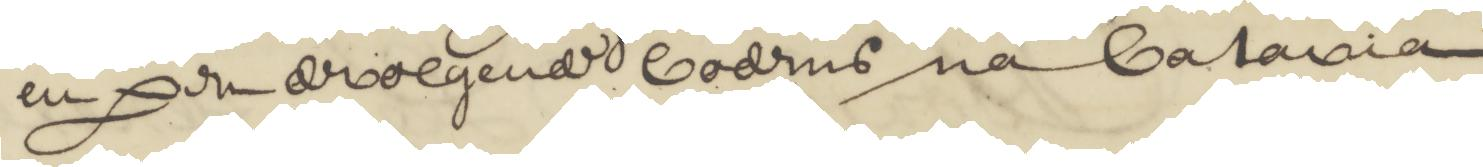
en per de volgende bodems na batavia
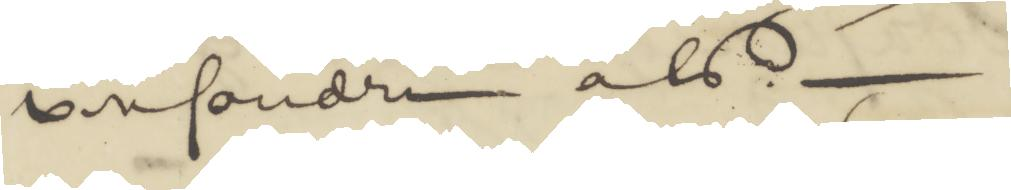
versonden als. _
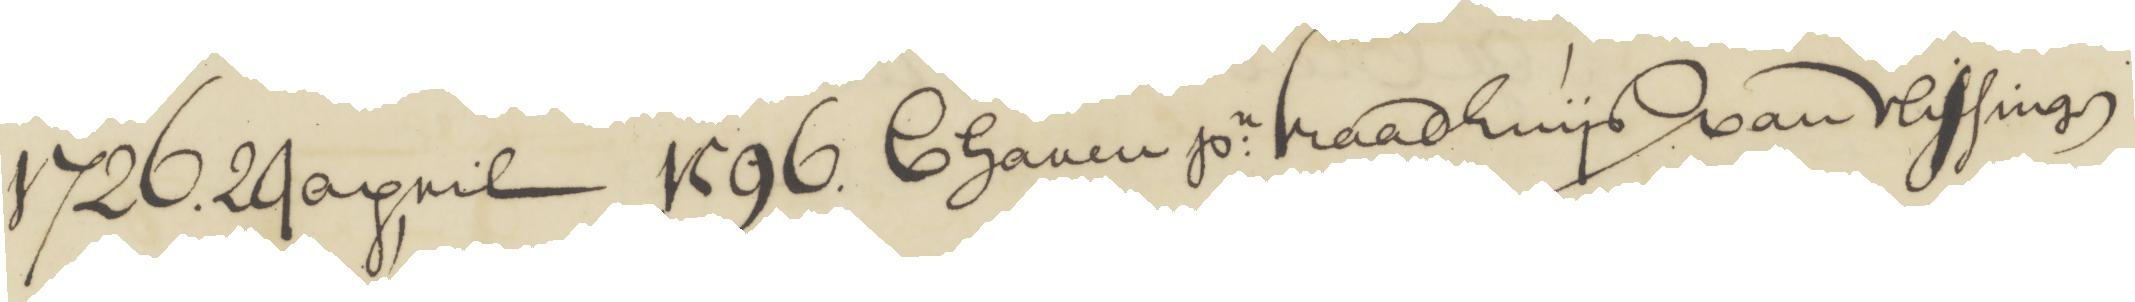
1726. 24 april 1596. bharen p:r traadhuijs van Vlissingen
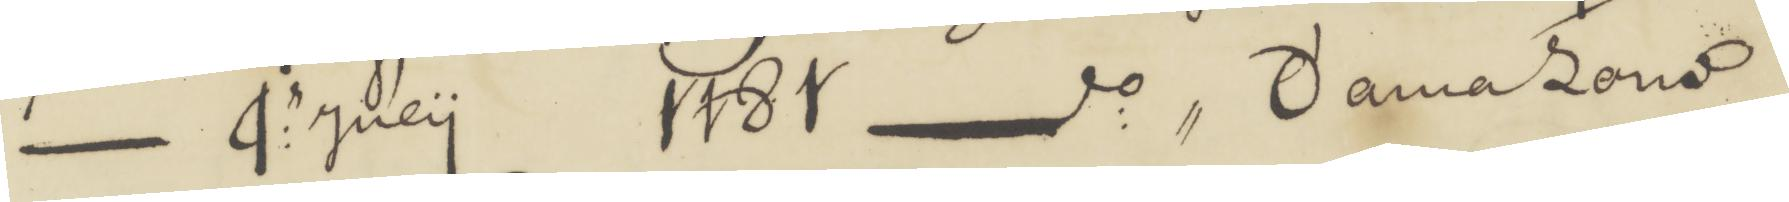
— 4:en Julij 1181 _:o „ d’ amazone
